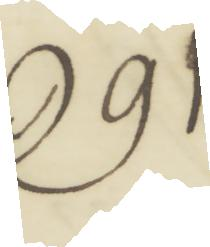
991
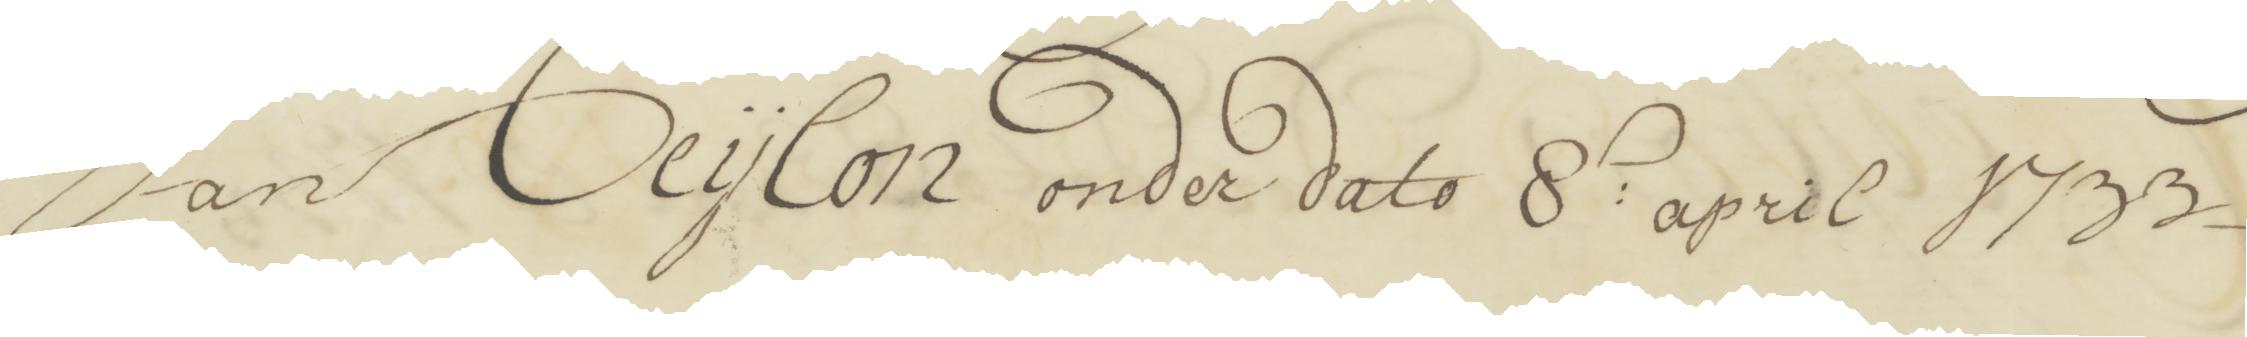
Van Ceijlon onder dato 8:e april: 1733.
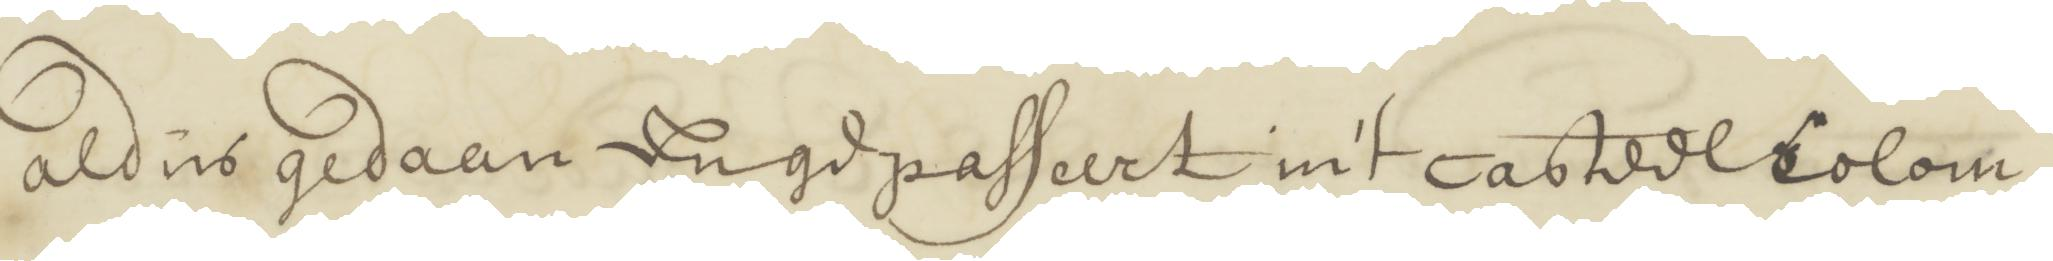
aldus gedaan en gepasseert in ’t casteel Colom
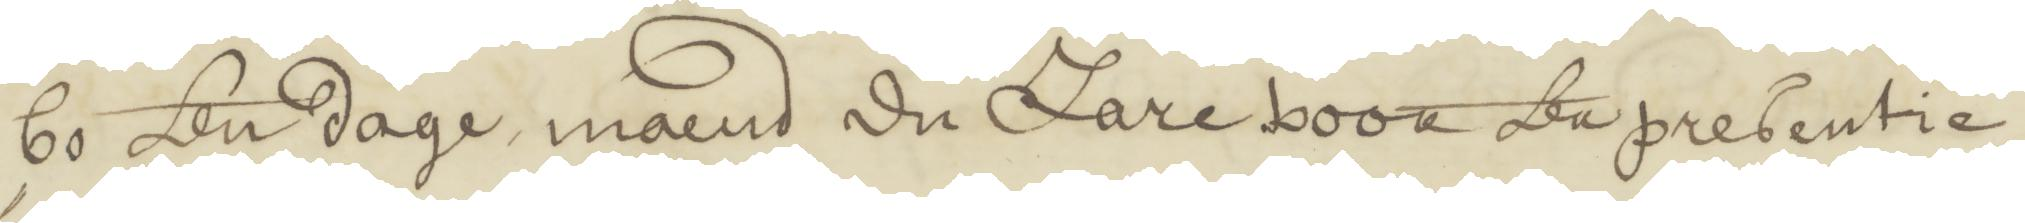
bo ten dage, maend en Iare voor ter presentie
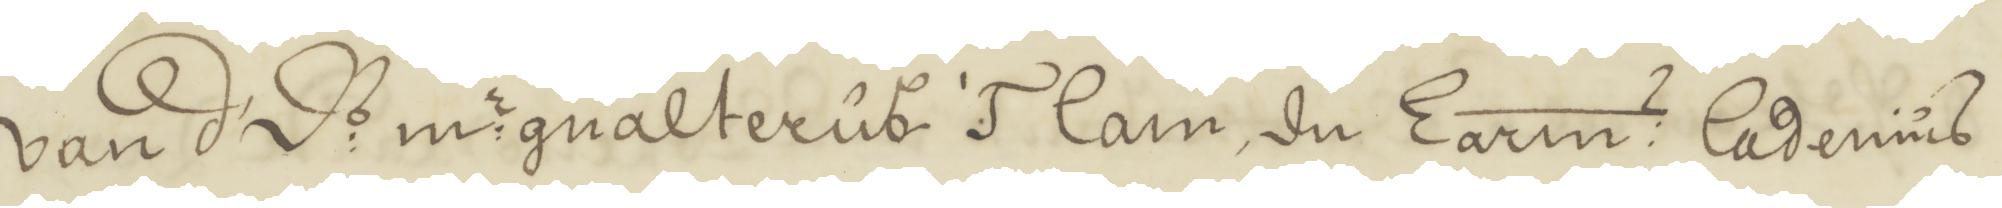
van d’ E:e m:r gualterus 'T lam, en harm:´ ladenius
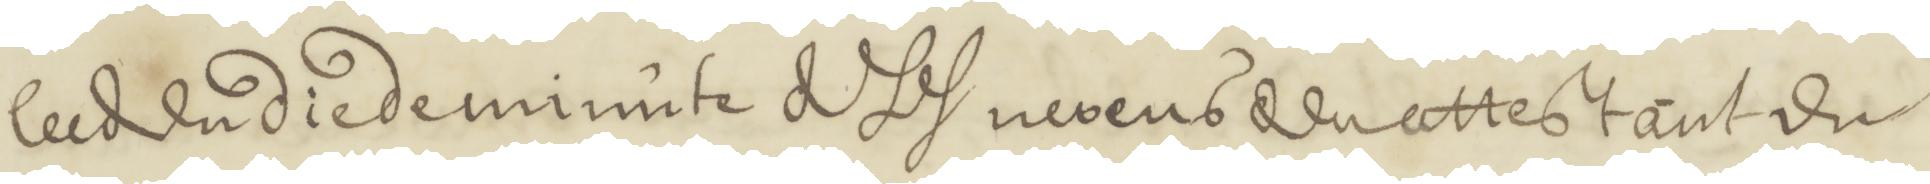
leeden die de minute deses nevens den attestant en
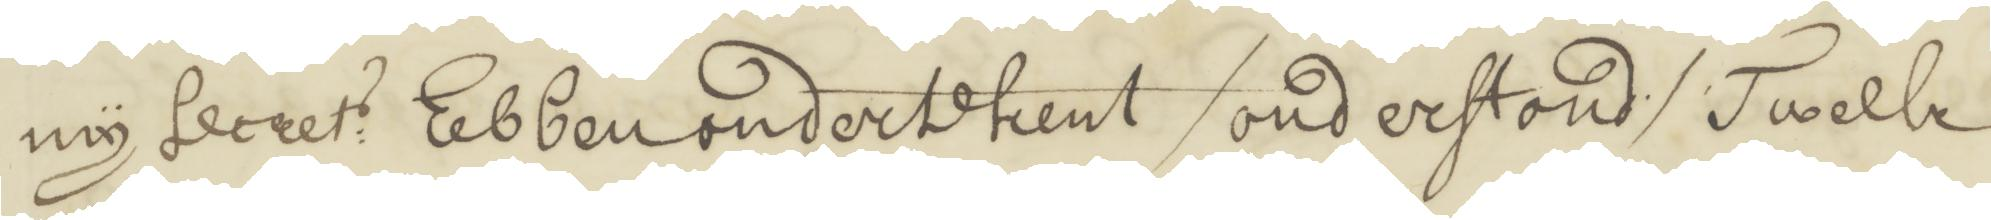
mij secret:s hebben ondertekent / onderstond:/ T welk
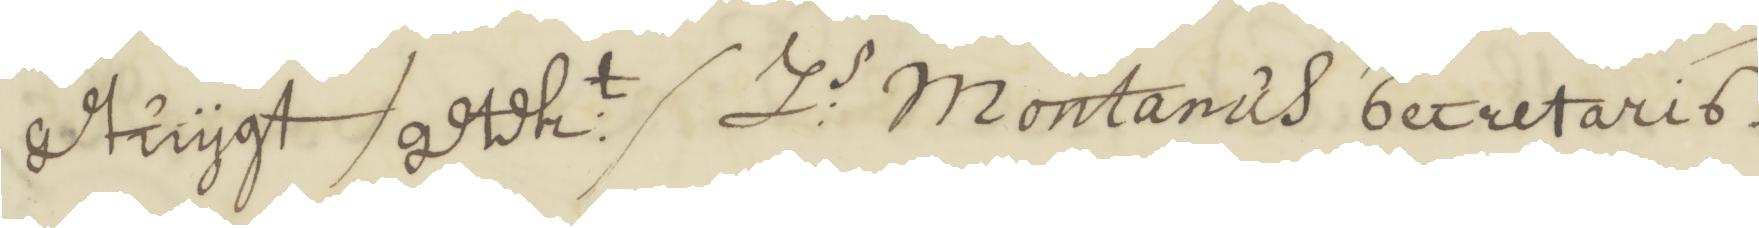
getuijgt / getek:t / I:s Montanus secretaris
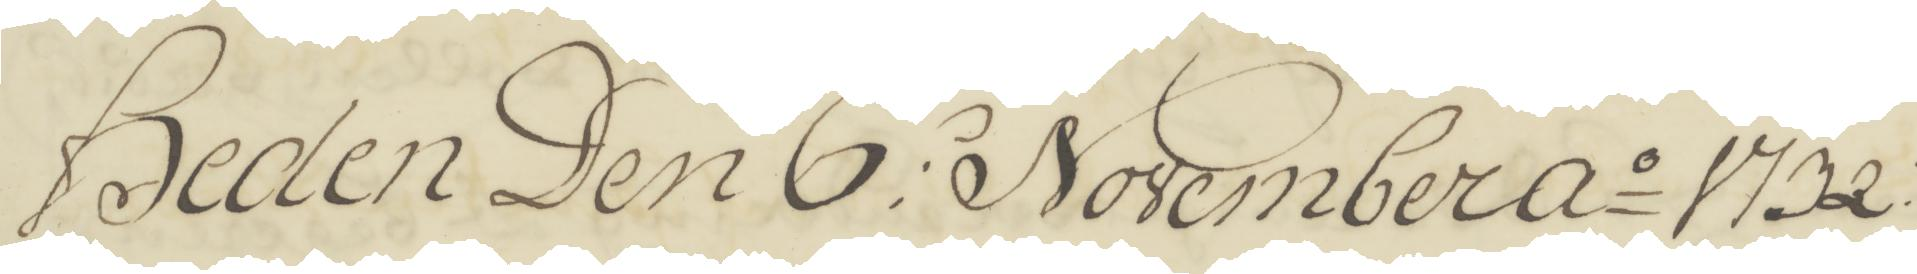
Heden Den 6:' November a=o 1732:
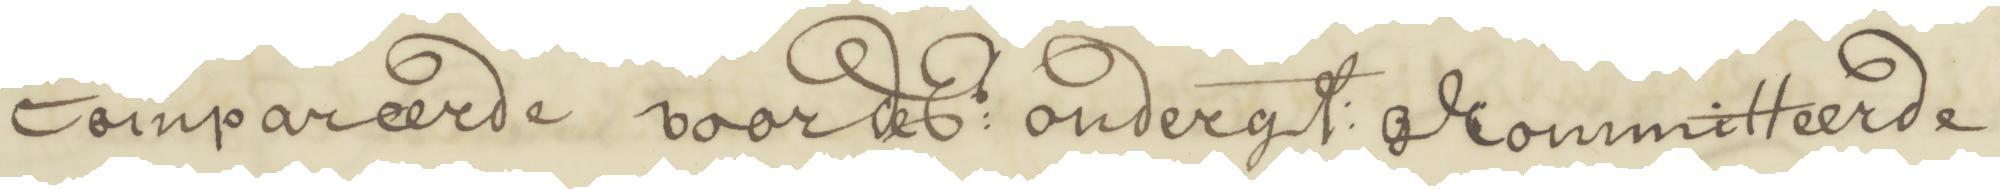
compareerde voor deE:s ondergt: gecommitteerde
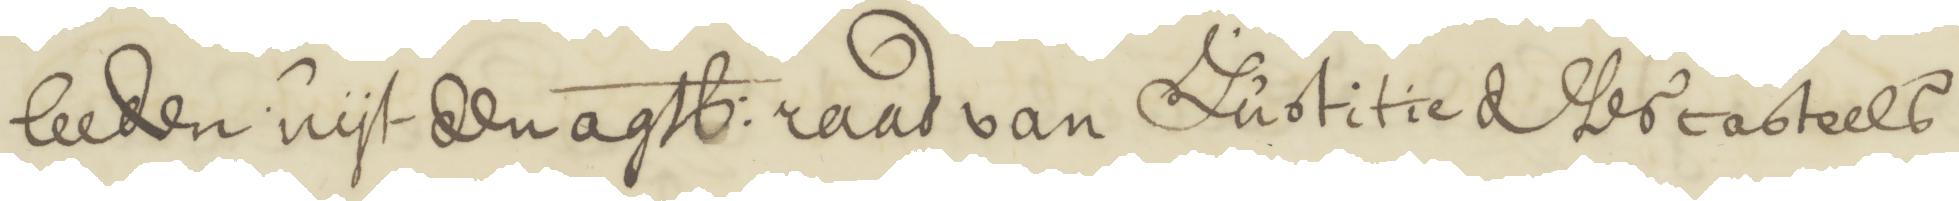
leeden uijt den agtb: raad van Iustitie deses casteels
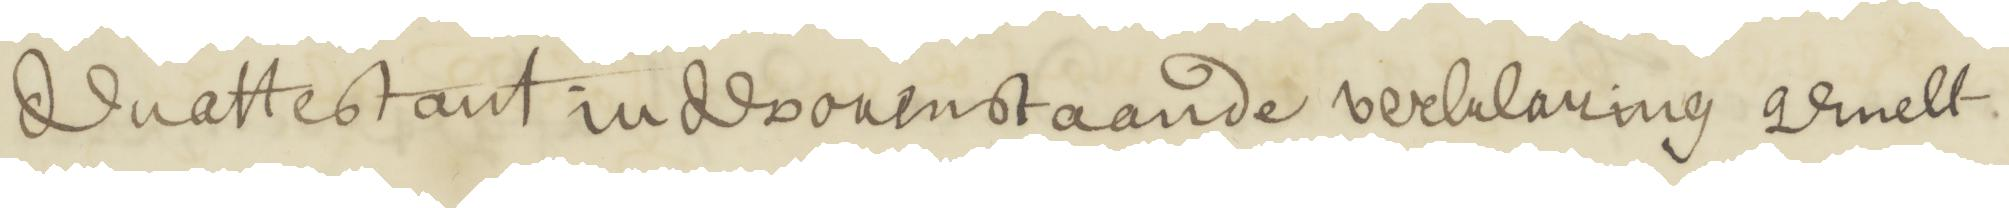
den attestant in de vorenstaande verklaring gemelt
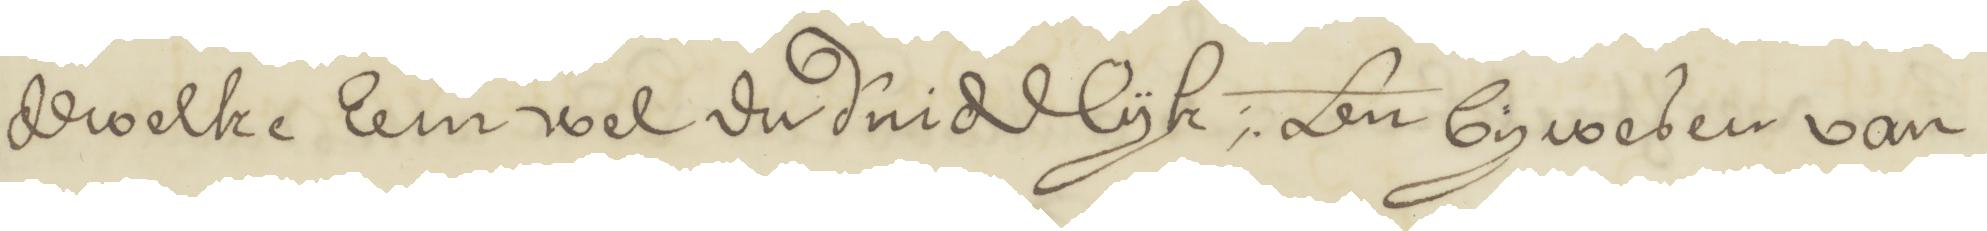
dewelke hem wel en duidelijk;. ten bij wesen van
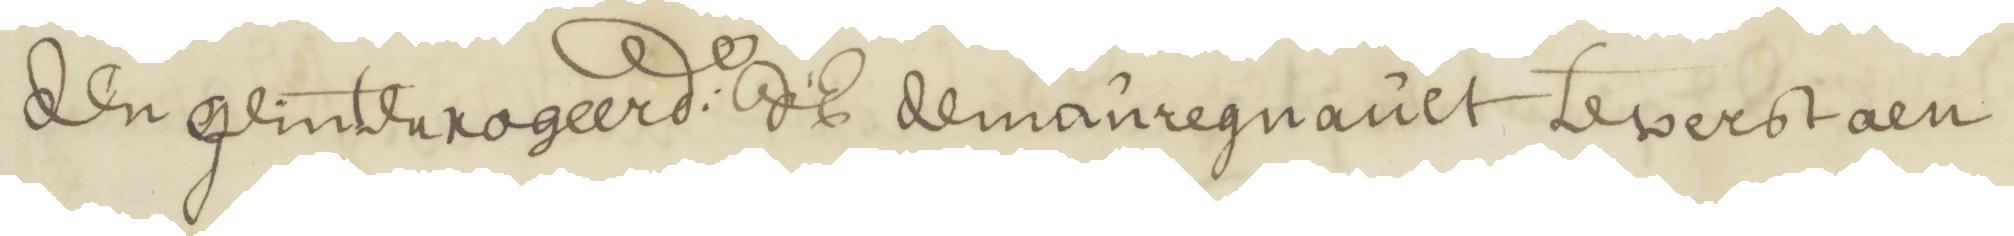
den geinterrogeerd:e d´E demauregnault te verstaen
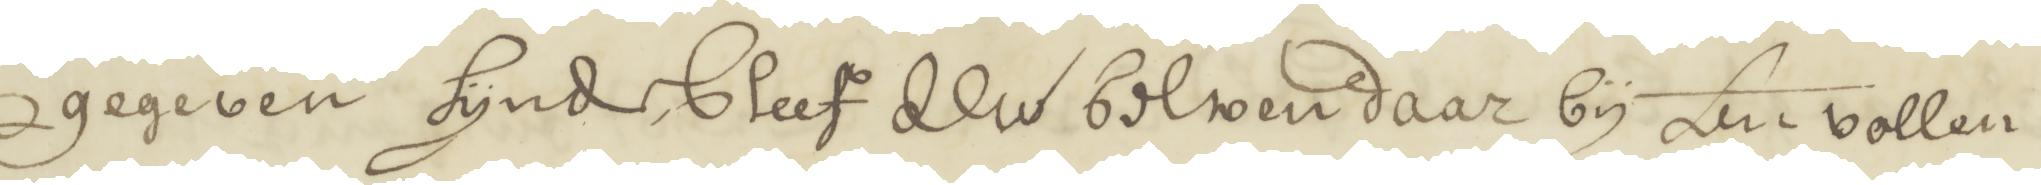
gegeven Sijnde bleef den selven daar bij ten vollen
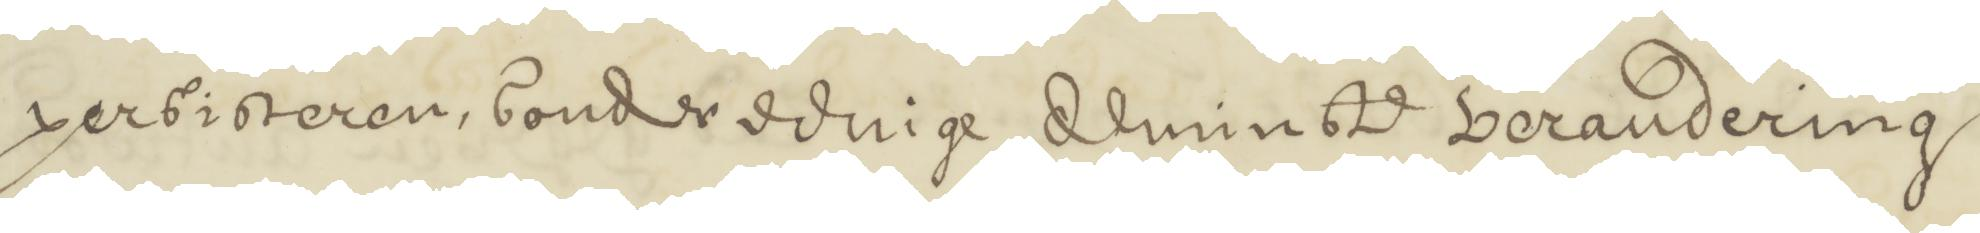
persisteren, sonder eenige de minste verandering
